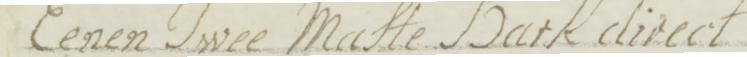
Eenen Twee Maste Bark direct
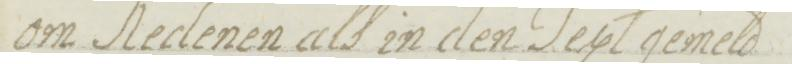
om Redenen als in den Text gemeld
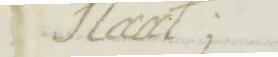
staat;
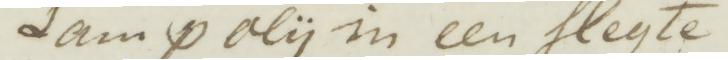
Lamp olij in een slegte
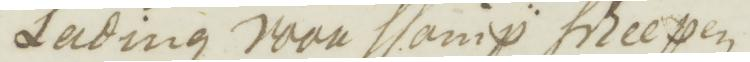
Lading voor 's Comp: scheepen,
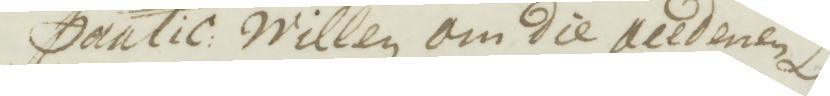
partic: willen om die reedenen
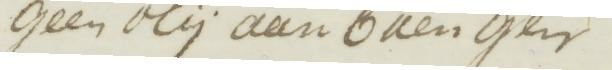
geen olij aanbrengen
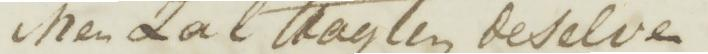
Men zal tragten deselve
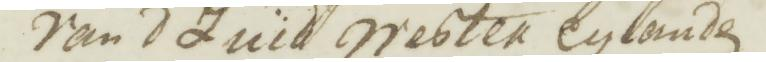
van d Zuid wester Eijlanden
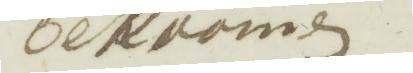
bekoomen
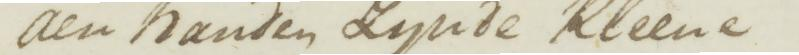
aen handen zynde kleene
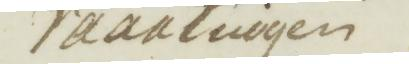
vaartuigen
